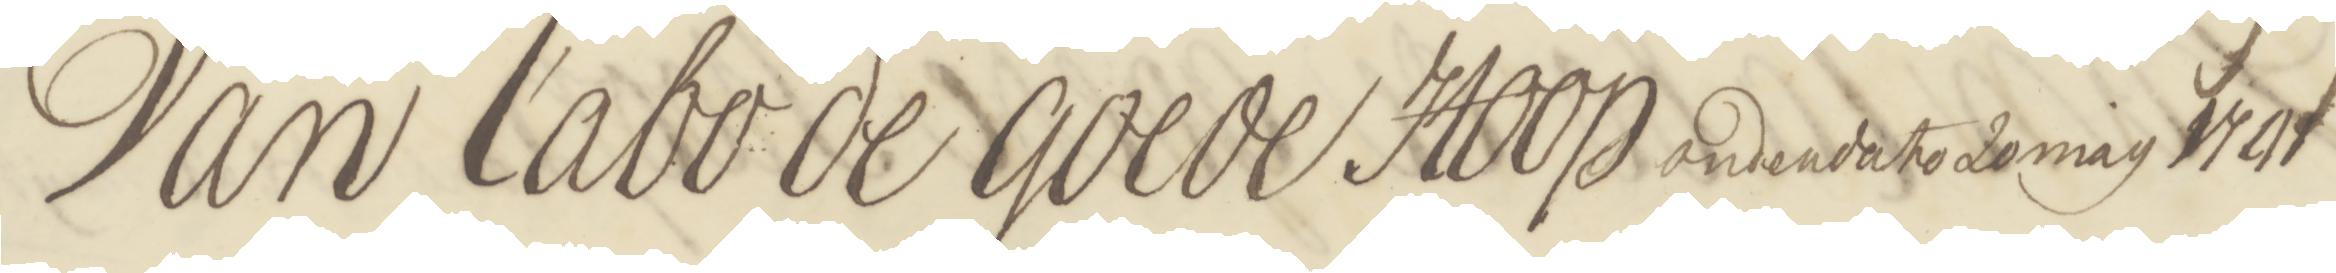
Van Cabo de goede Hoop onder dato 20 maij 1741
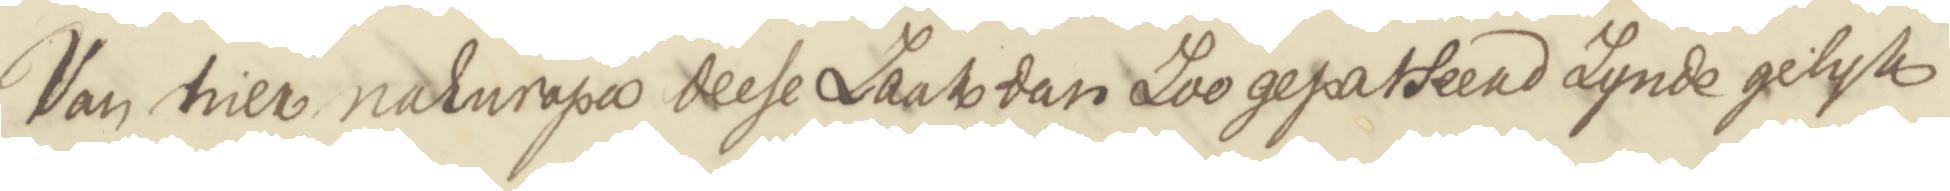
Van hier na Europa deese zaak dan zoo gepasseerd zynde gelyk
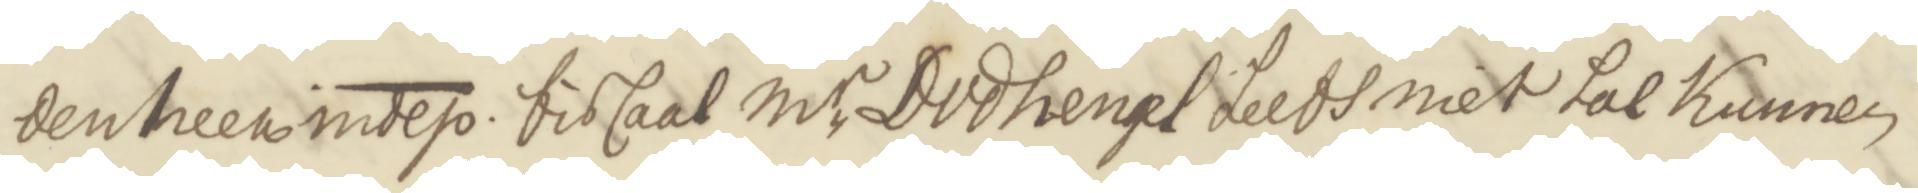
den heer indep. fiscaal m„r Dvdhenel zelfs niet sal kunnen
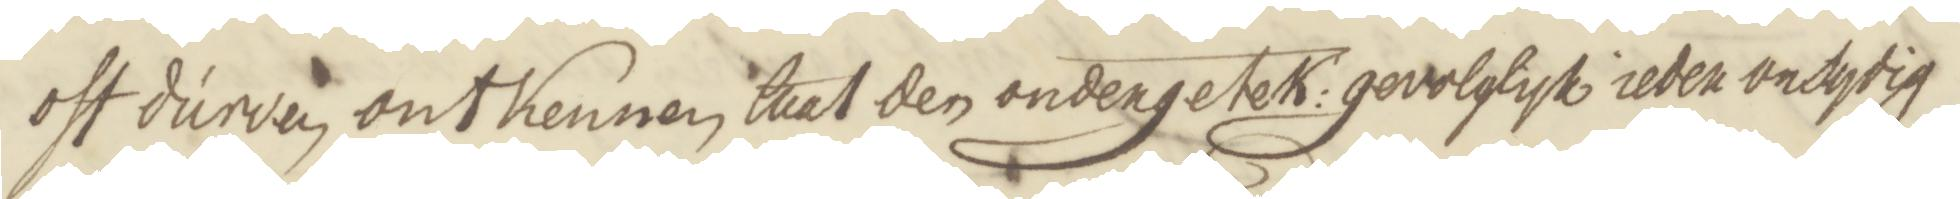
oft durven ontkennen laat den ondergetek: gevolglijk ieder onsydig
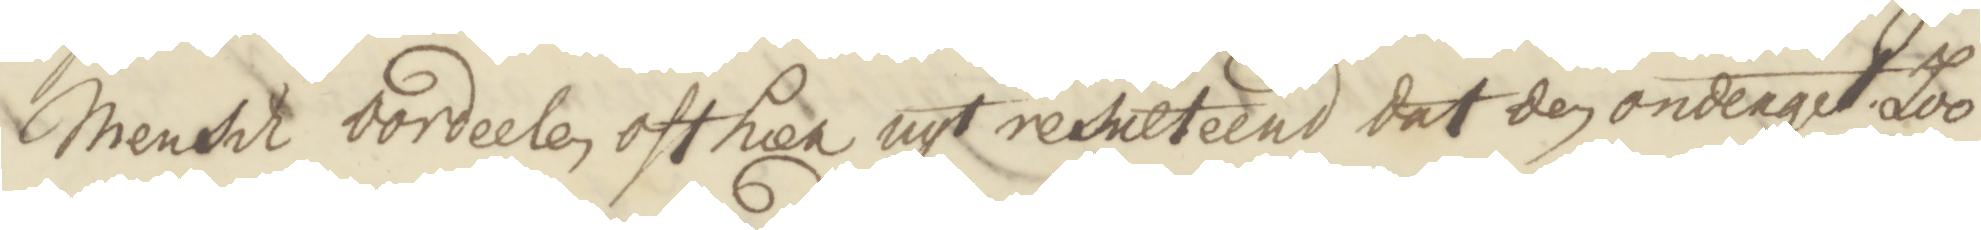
mensch oordeelen oft hier uyt resulteerd dat den onderget. zoo
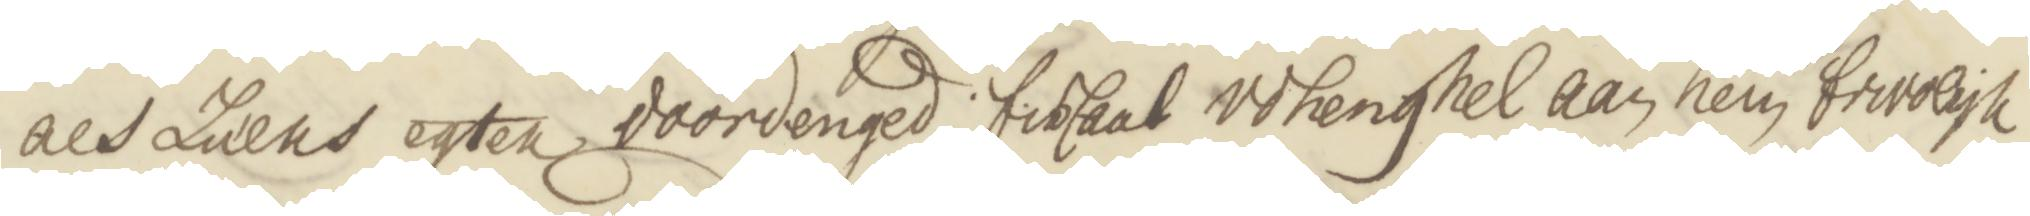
als zulks egter door den ged: fiscaal vdhenghel aan hem frivolijk
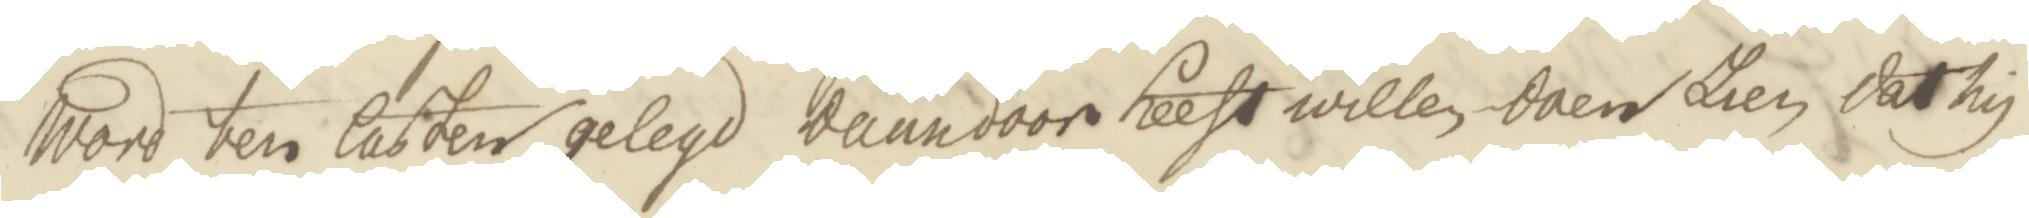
word ten lasten gelegd daardoor heeft willen doen zien dat hij
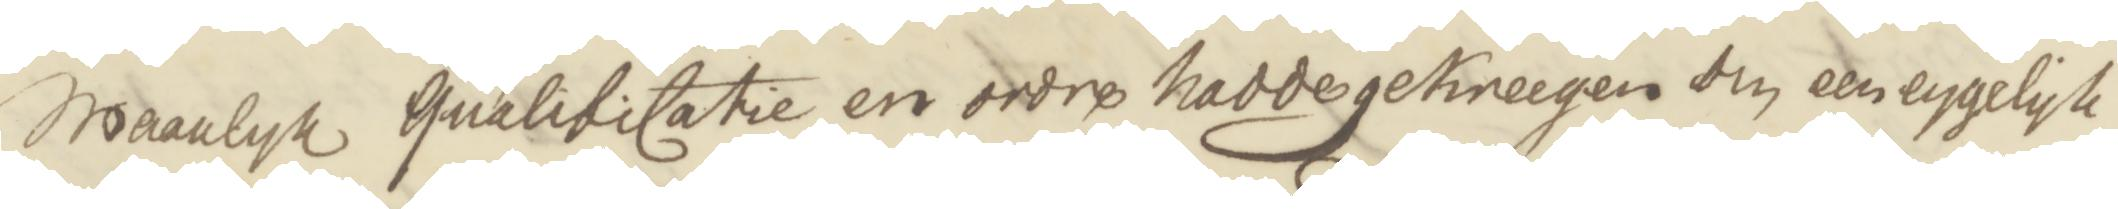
waarlyk qualificatie en ordre hadde gekreegen om een eygelijk
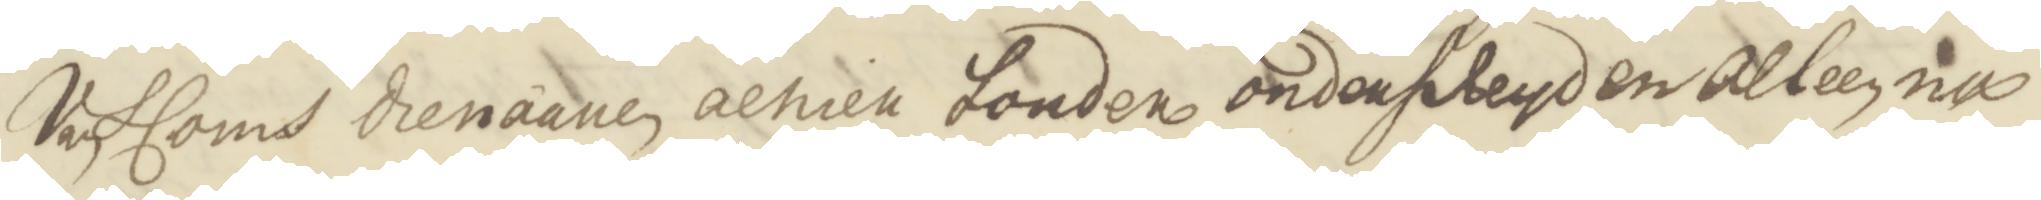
van sComs dienaaren alhier sonder onderscheyd en alleen na
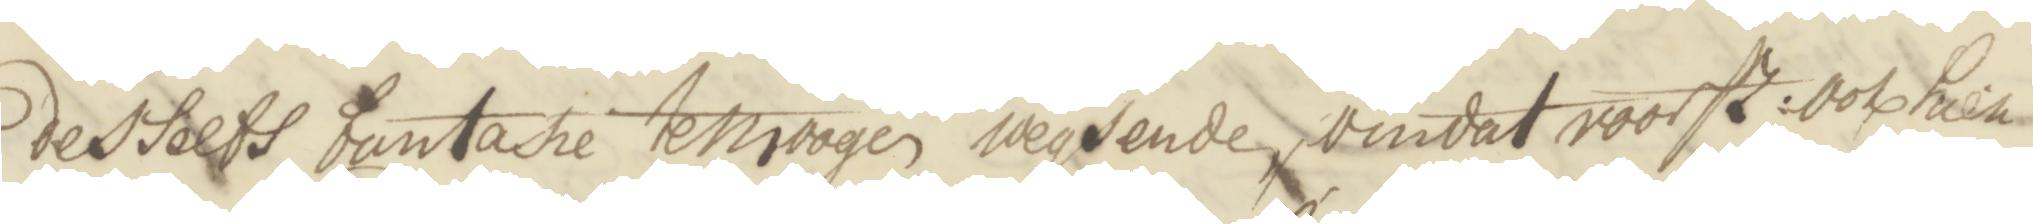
desselfs fantasie te moogen weysende, vindat voorsz: ook hier
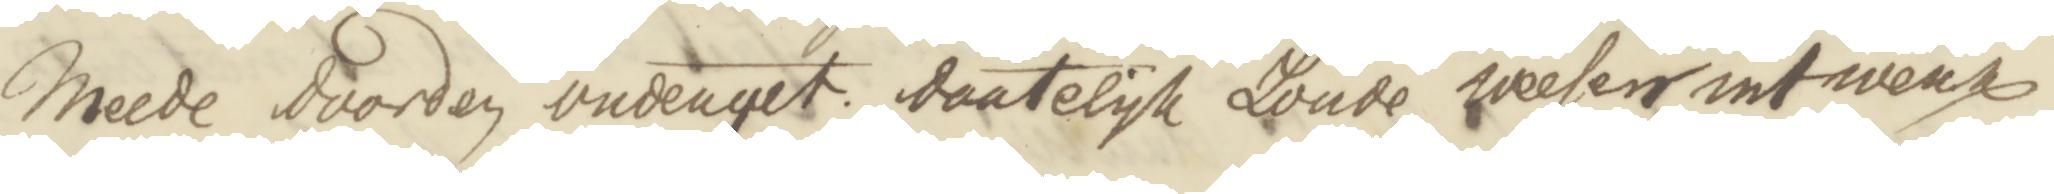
meede door den onderget. daatelijk zoude weesen in't werk
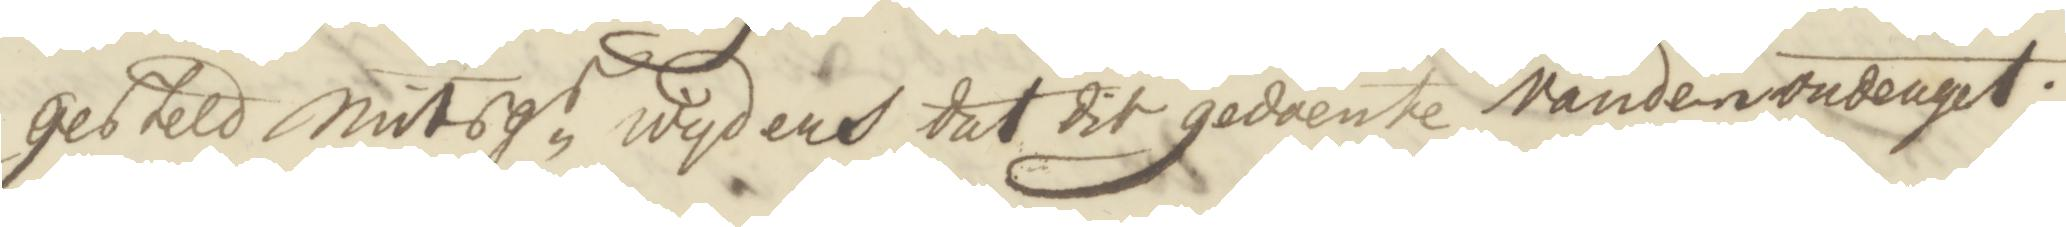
gesteld mitsg„s wijders dat dit gedoente vanden onderget.
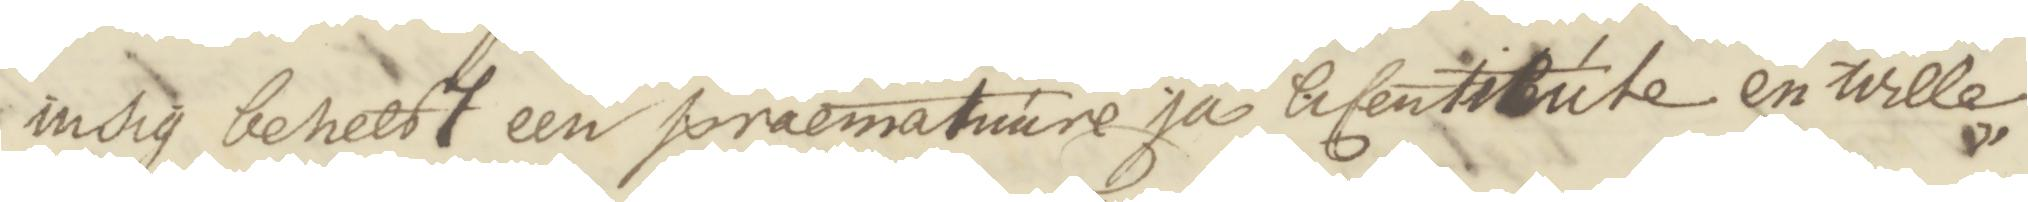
insig behelst een praematuure ja licentieuse en wille„
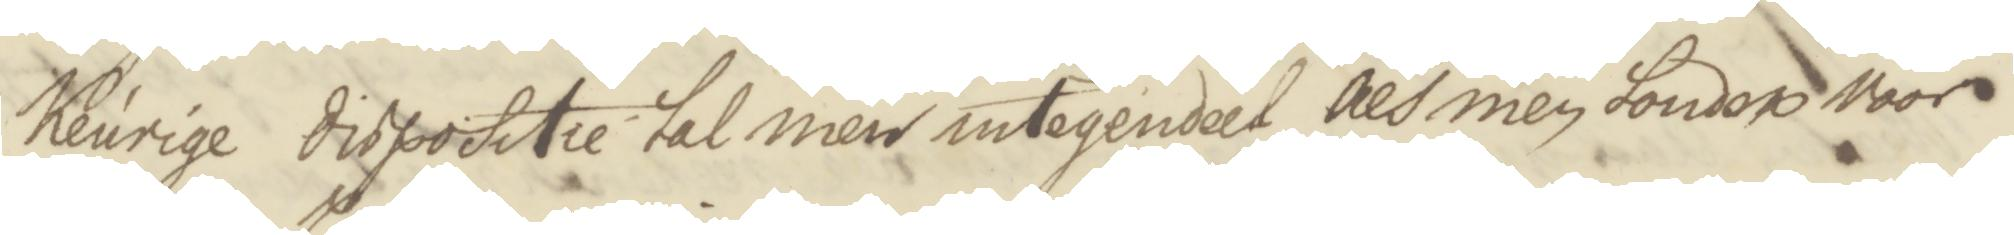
keurige dispositie sal men integendeel als men sonder voor
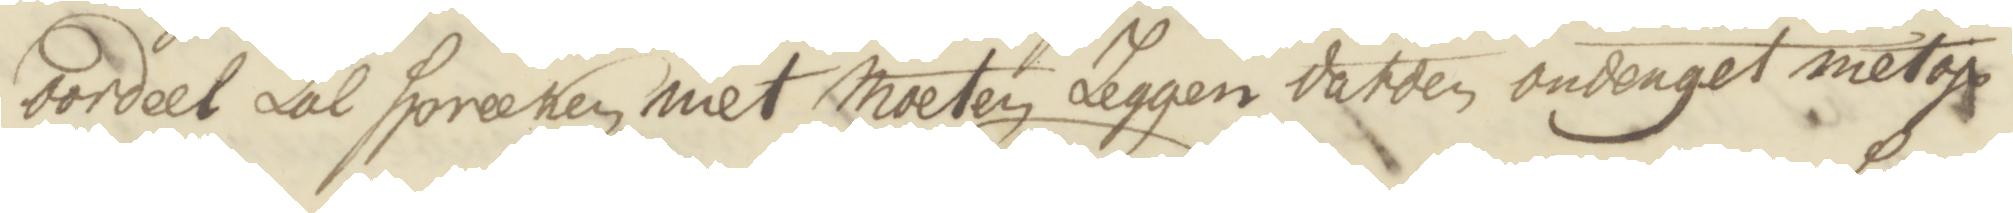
oordeel zal spreeken niet moeten zeggen datden onderget met op
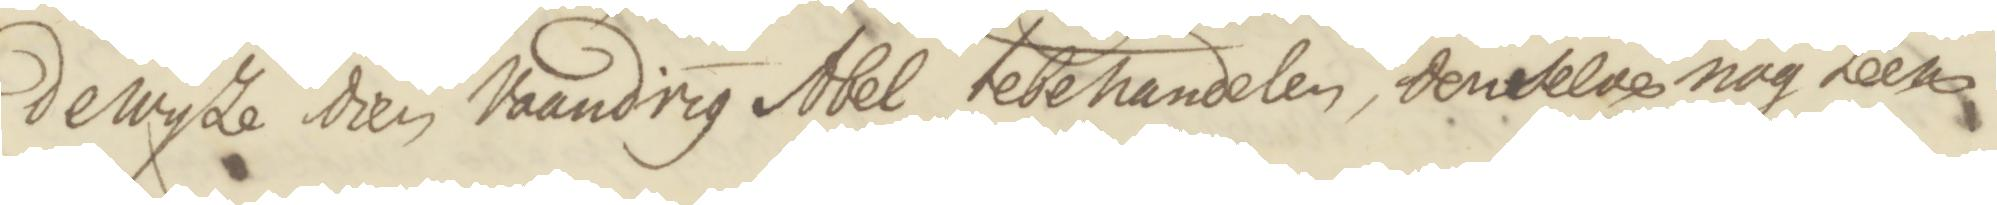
de wijze dien vaandrig Abel te behandelen, denselve nog seer
